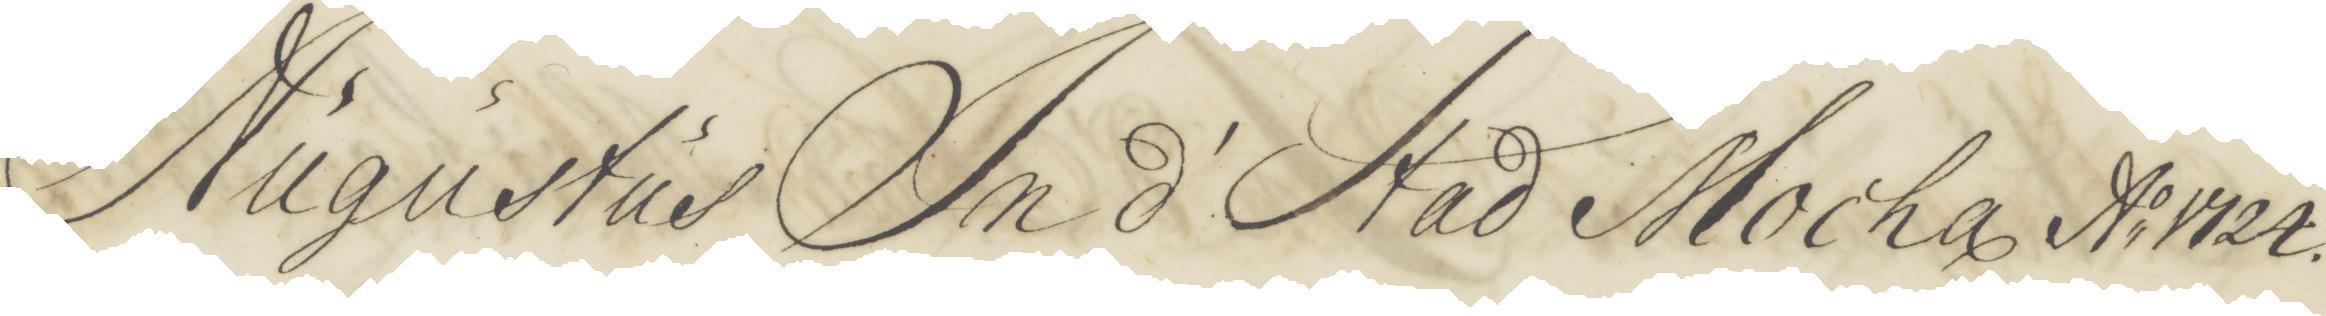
Augustus In d’ Stad Mocha A„o 1724.
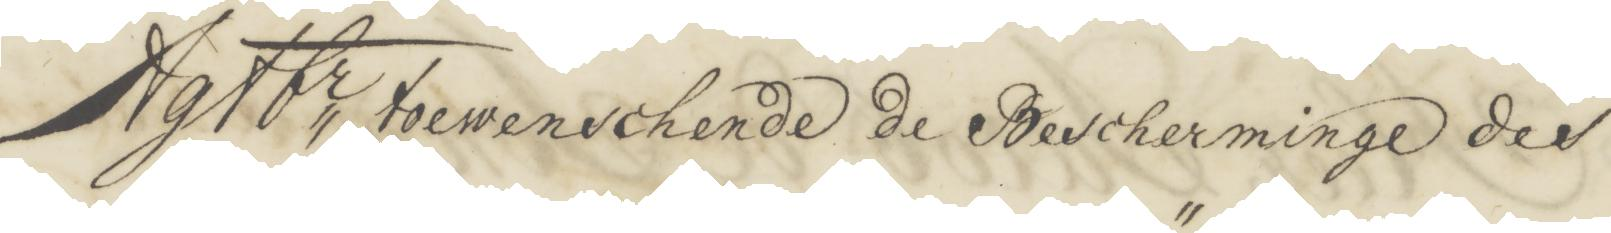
Agtb„r toewenschende de Bescherminge des
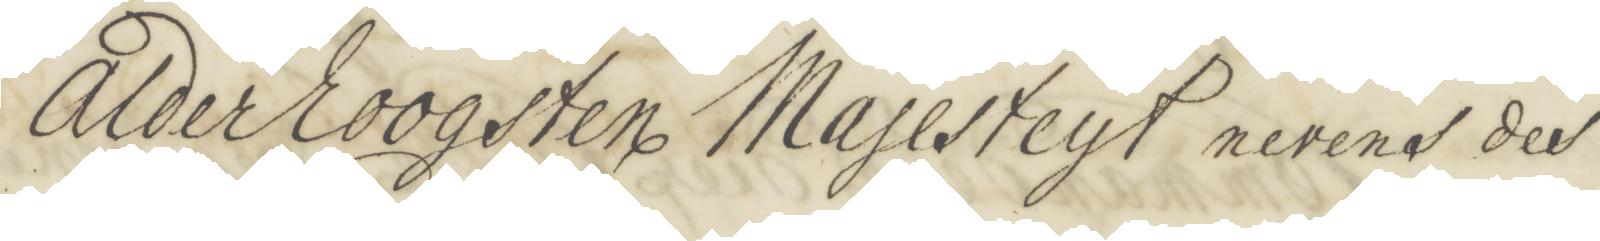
alderhoogsten Majesteijt nevens des
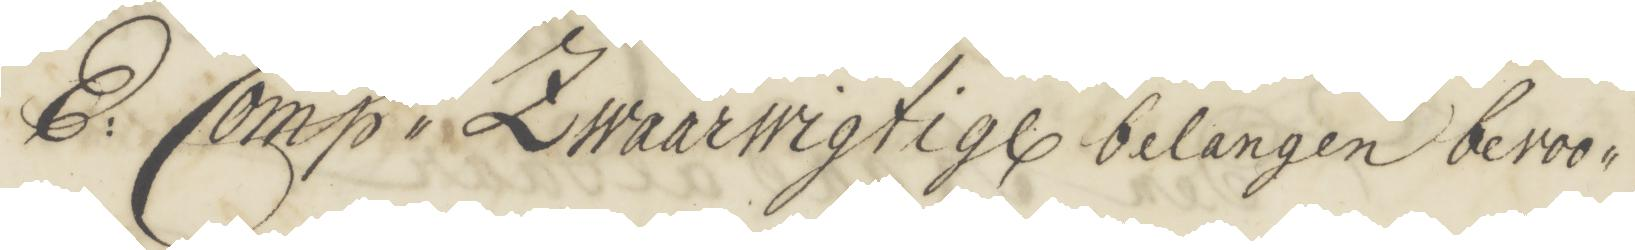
E: Comp„s Zwaarwigtige belangen bevoo„
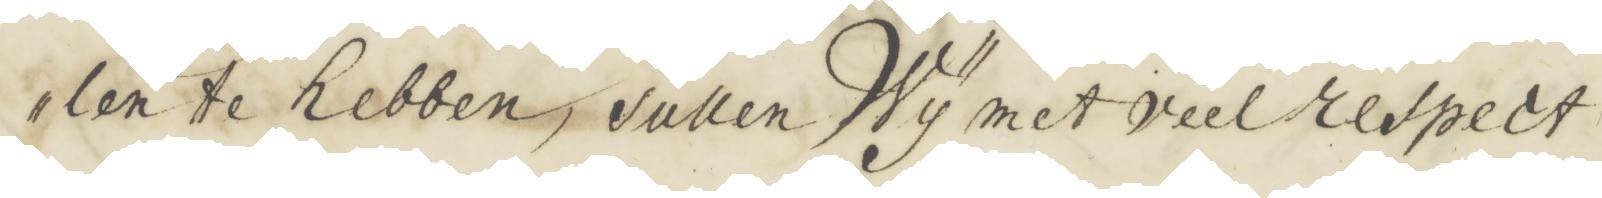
„len te hebben, sullen Wij met veel respect
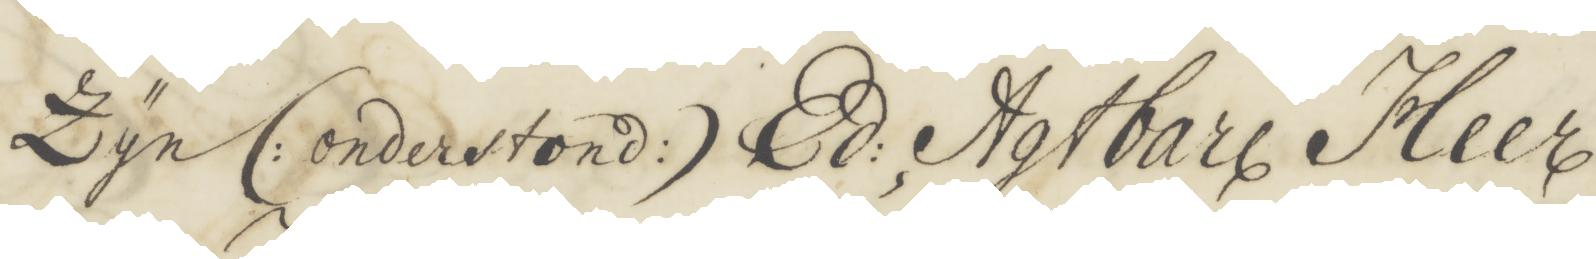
Zijn (:onderstond:) Ed: Agtbare Heer
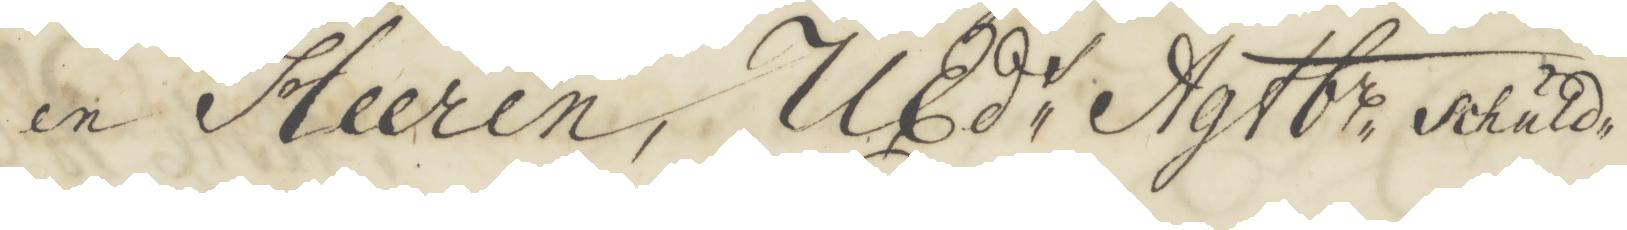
en Heeren, UEd„s Agtb„r schuld„
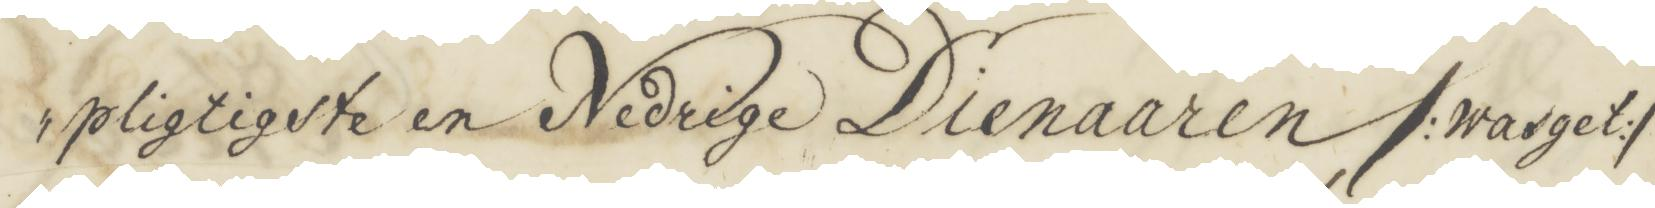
„pligtigste en Nedrige Dienaaren /:was get:/
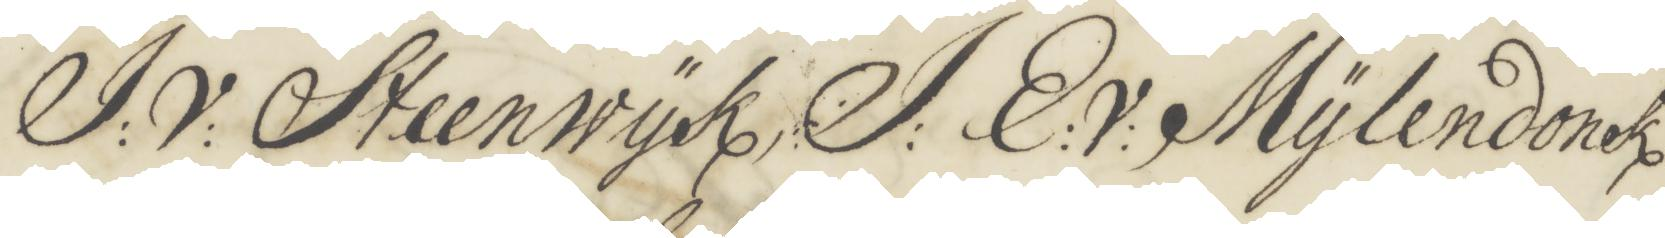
I: v: Steenwijk, I: E: v: Mijlendonk
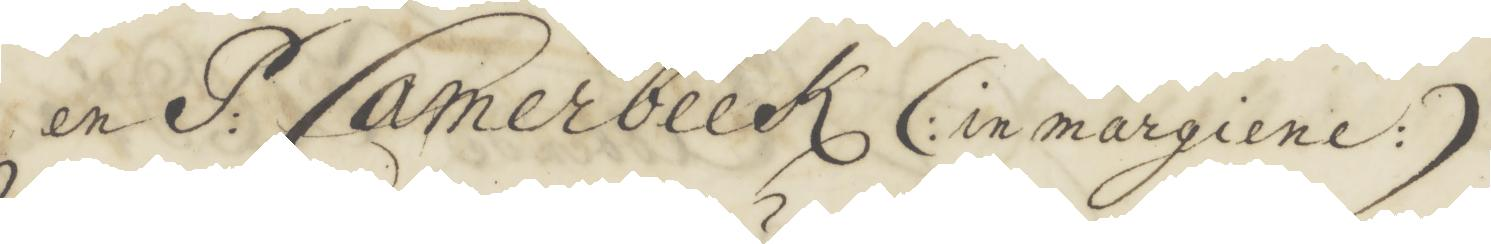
en P: Camerbeek (:in margiene:)
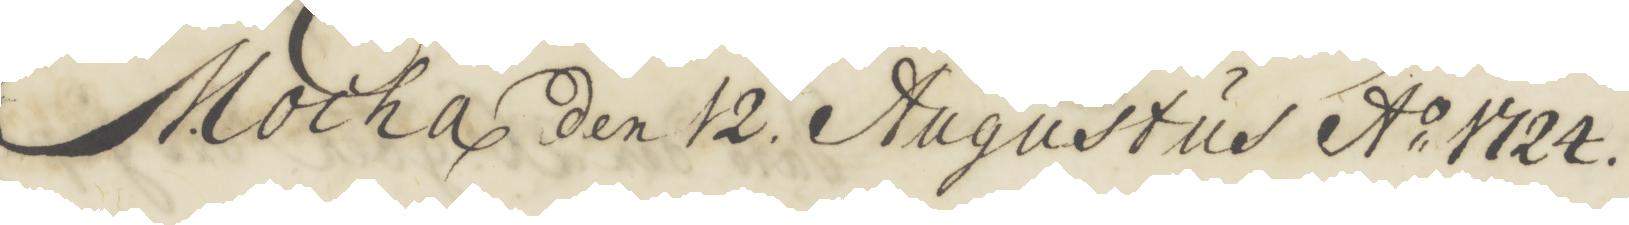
Mocha den 12.' Augustus A„o 1724.
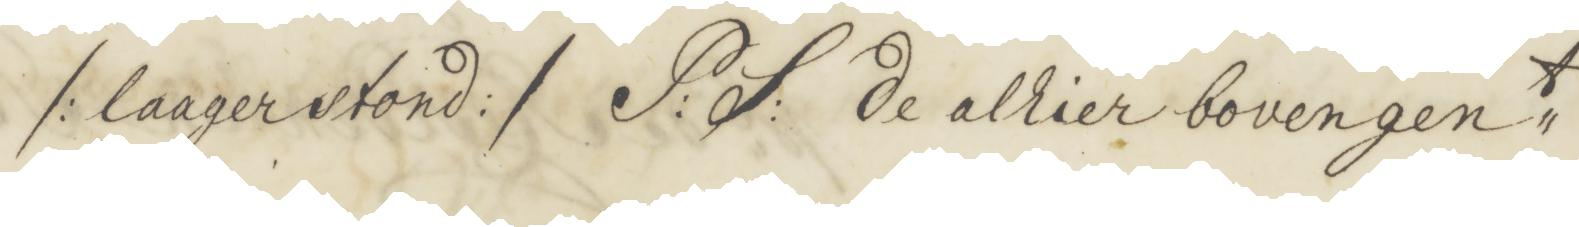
/: laager stond :/ P: S: de alhier boven gen„t
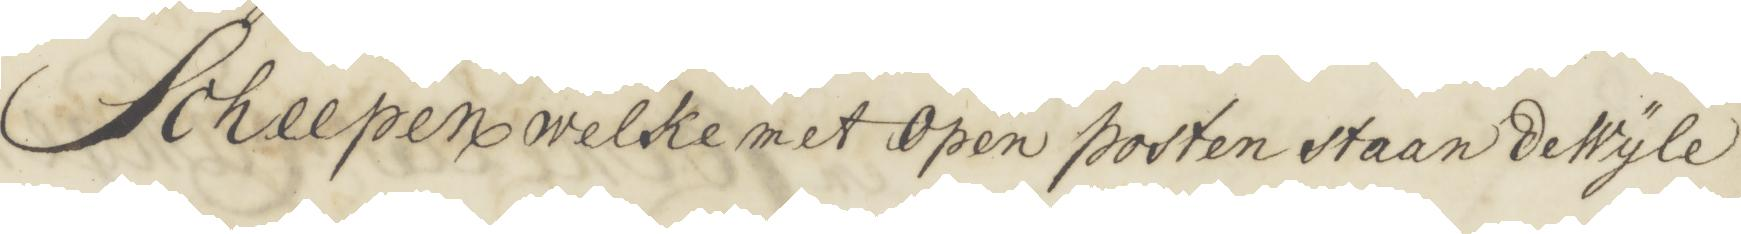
Scheepen welke met open posten staan de wijle
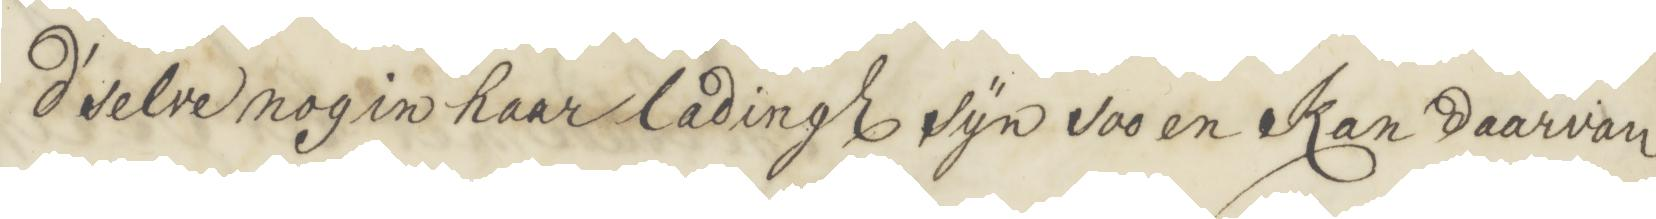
d’selve nog in haar ladingh sijn soo en kan daarvan
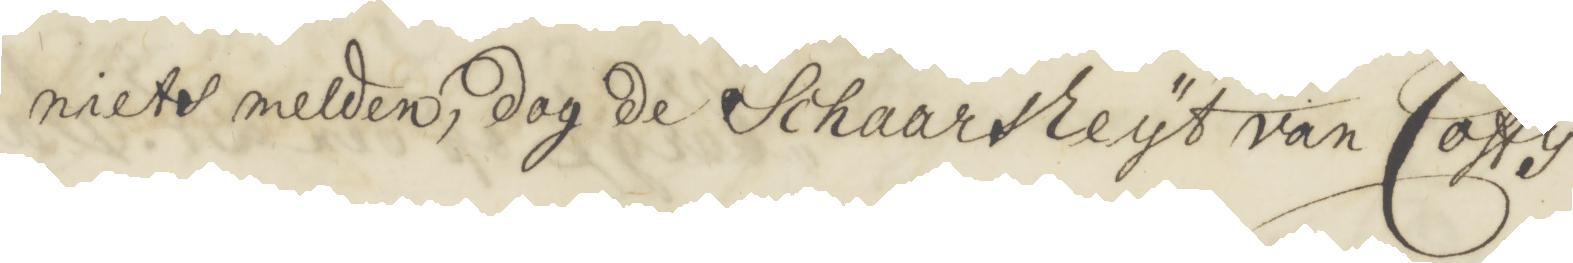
niets melden, dog de schaarsheijt van Coffij
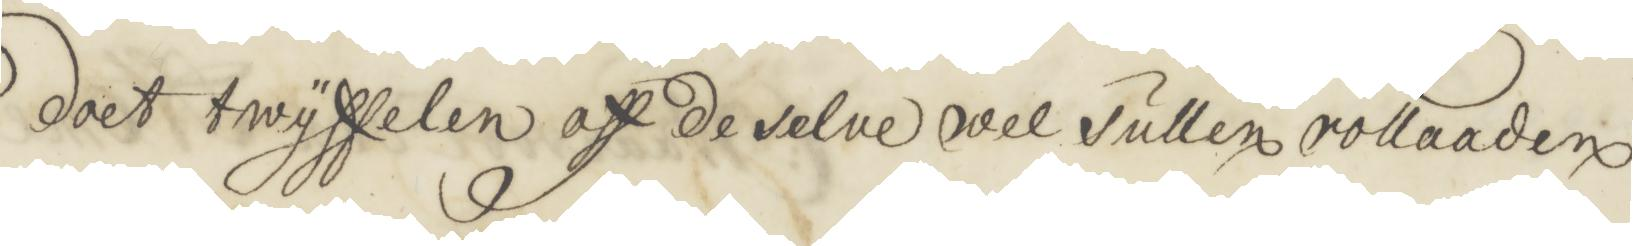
doet twijffelen off de selve wel sullen vollaaden
